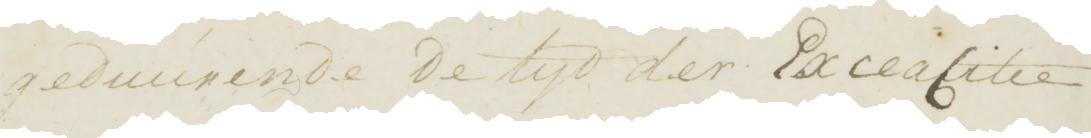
geduurende de tijd der Exceacitie
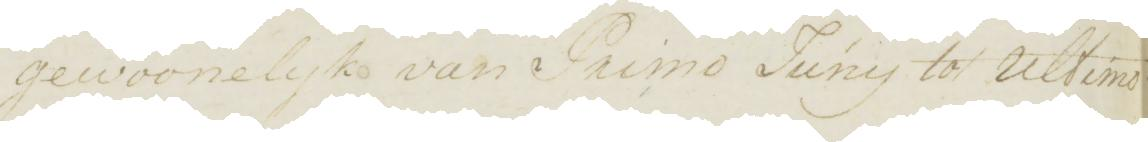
gewoonelijk van Primo Juny tot Ultimo
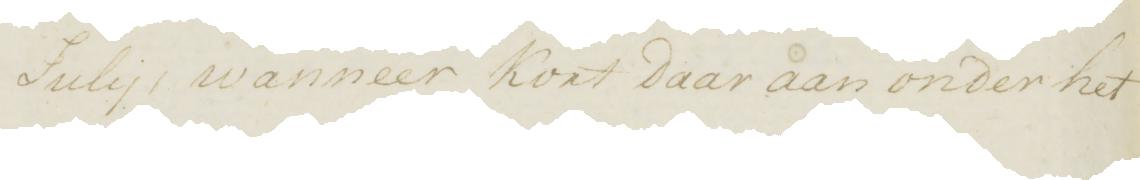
Julij, wanneer Kort daar aan onder het
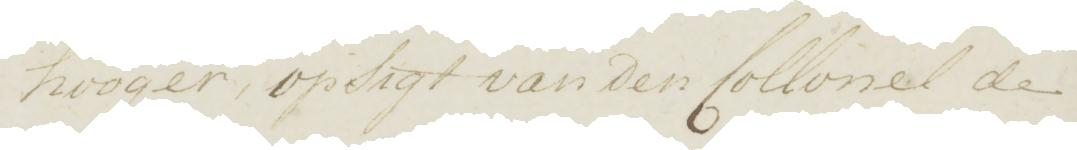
hooger, opsigt van den Collonel de
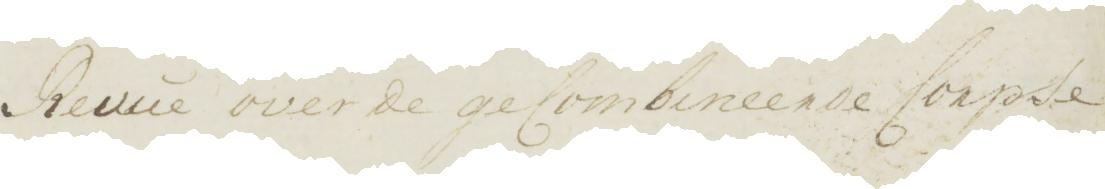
Revue over de gecombineerde Corpse
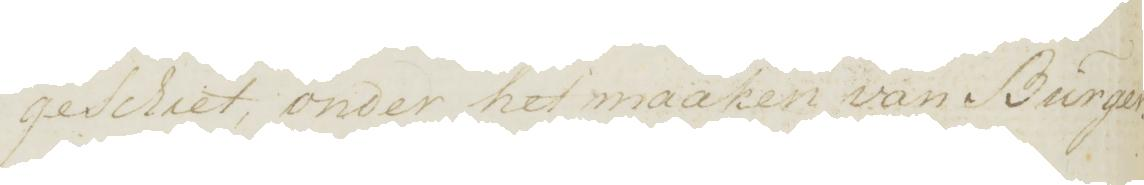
geschiet, onder het maaken van Burger
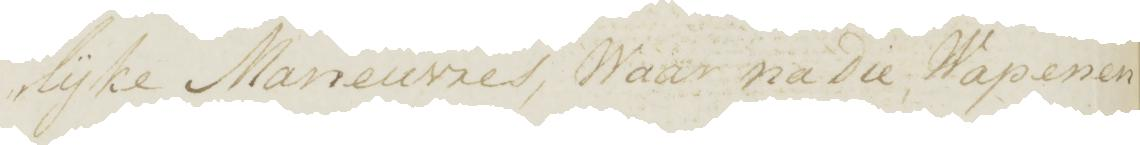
„lijke Maneuvres, Waar na die, Wapenen
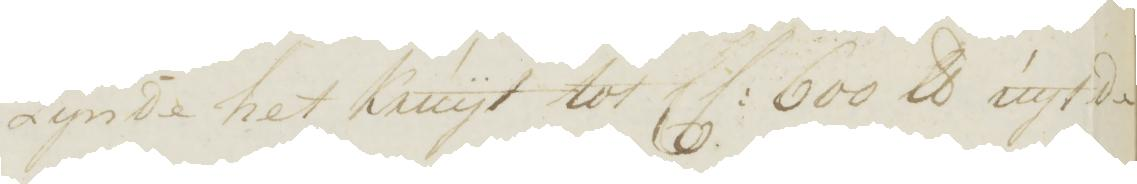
lynde de het kruijt tot cc: 600 lb uyt de
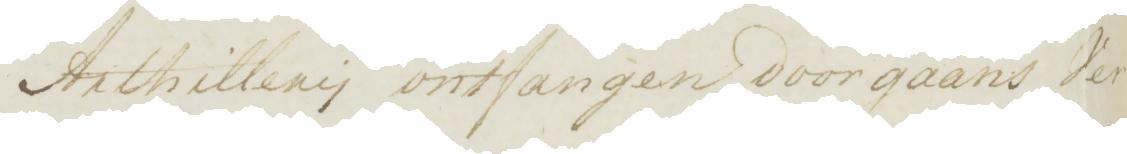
Arthillerij ontfangen door gaans Ver
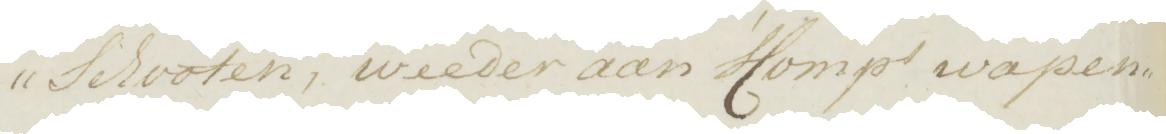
„schooten, weeder aan ’sComps wapen„
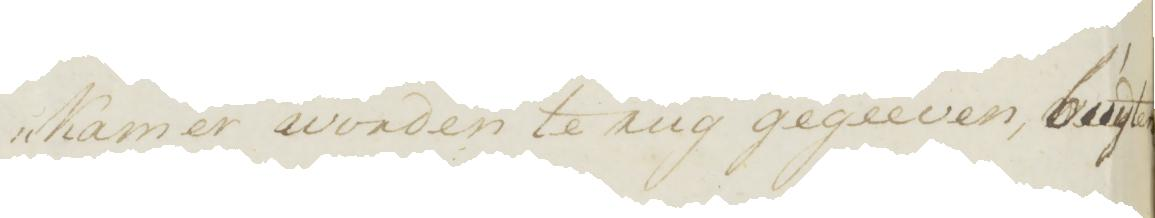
„kamer worden terug gegeeven, buyten
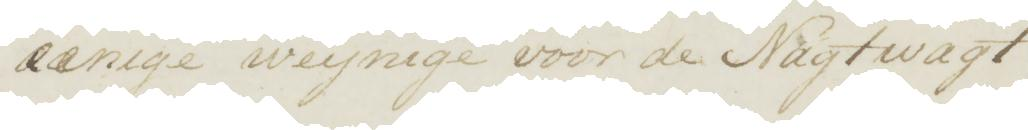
eenige weynige voor de Nagtwagt
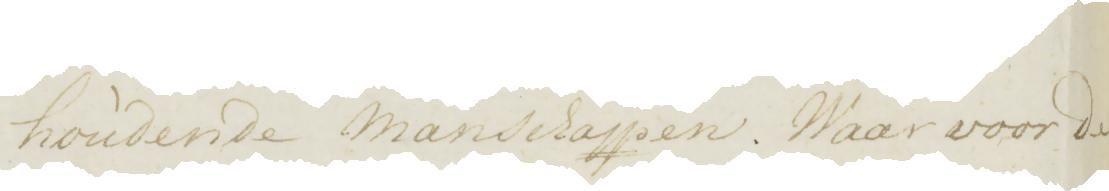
houdende manschappen. Waar voor de
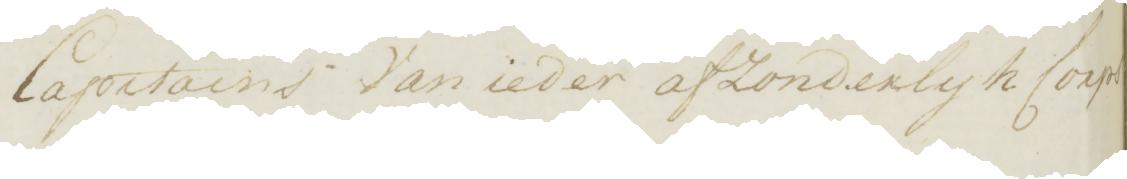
Capitains Van ieder afzonderlijk Corps
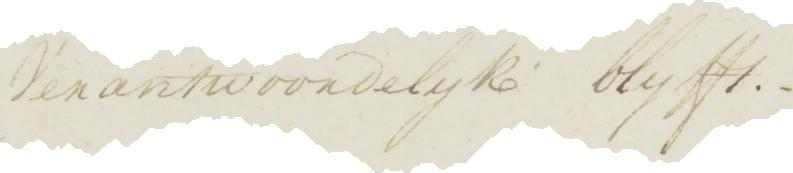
Verantwoordelijk blijfft.-
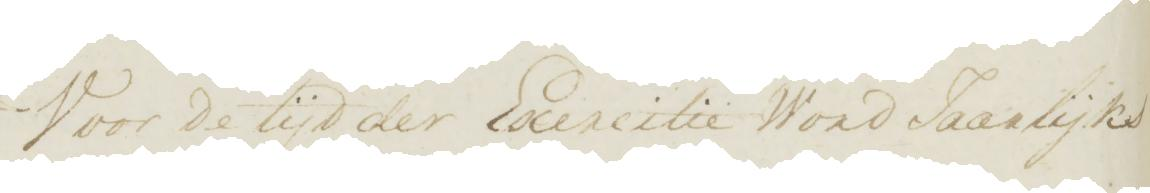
Voor de tijd der Exercitie Word Jaarlijks
